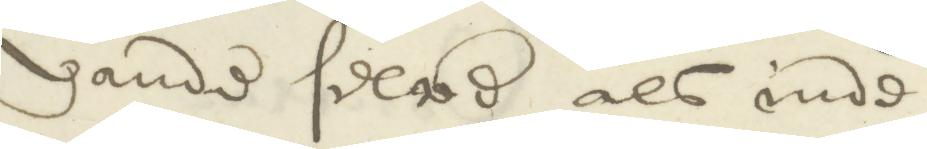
vande selve als inde
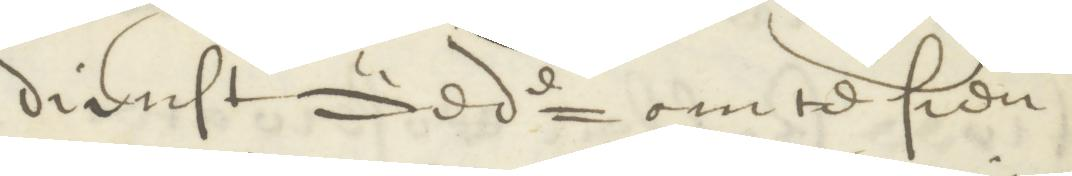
dienst Eed=e om te sien
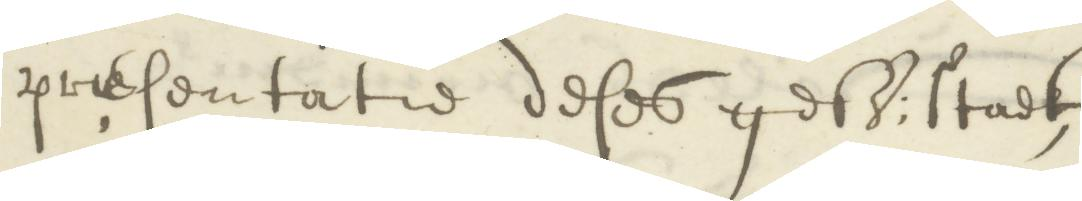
presentatie deses gesz: staet,
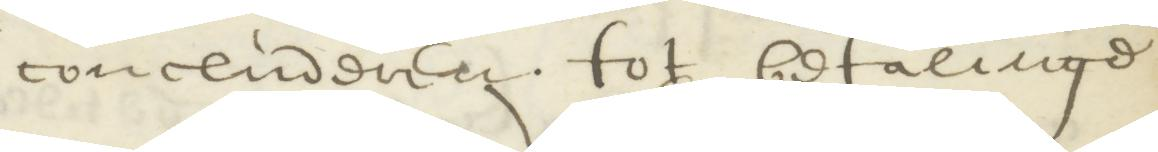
concluderen tot betalinge
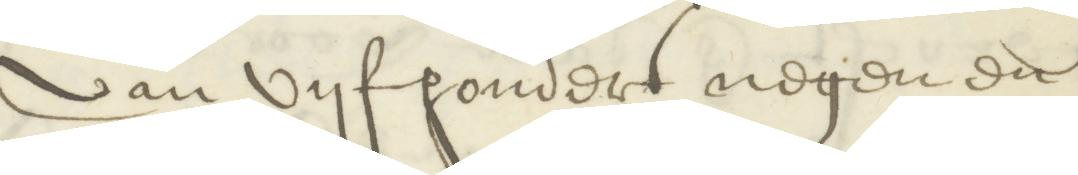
van vyfhondert negen en
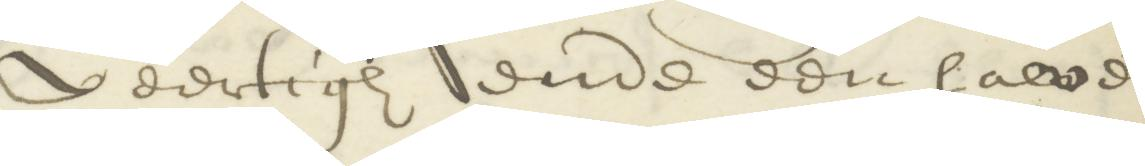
veertigh ende een halve
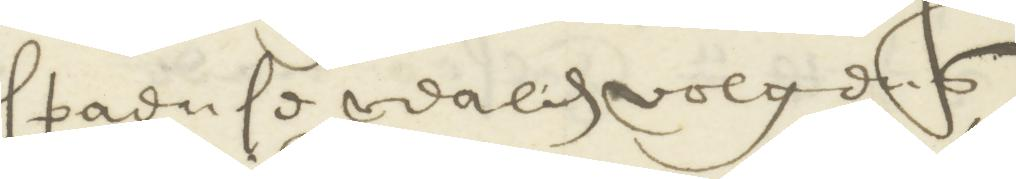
spaense realen volgens
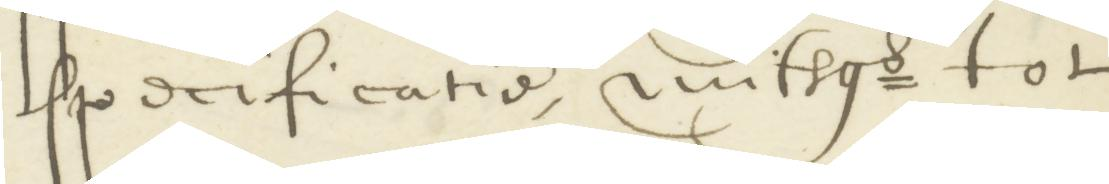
specificatie, mitsg=s tot
